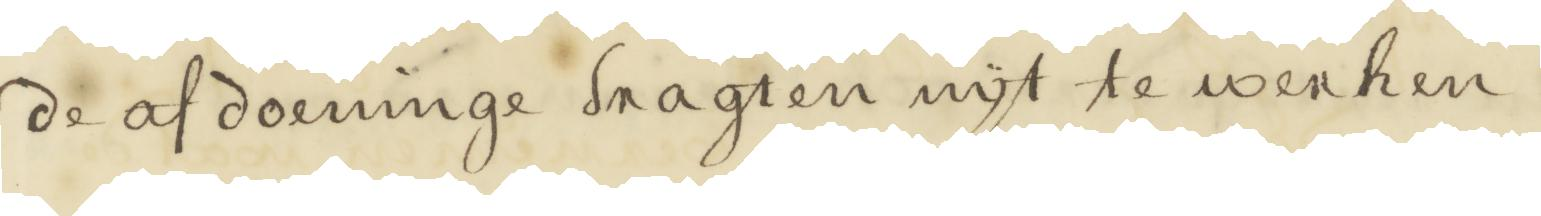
de af doeninge tragten uijt te werken
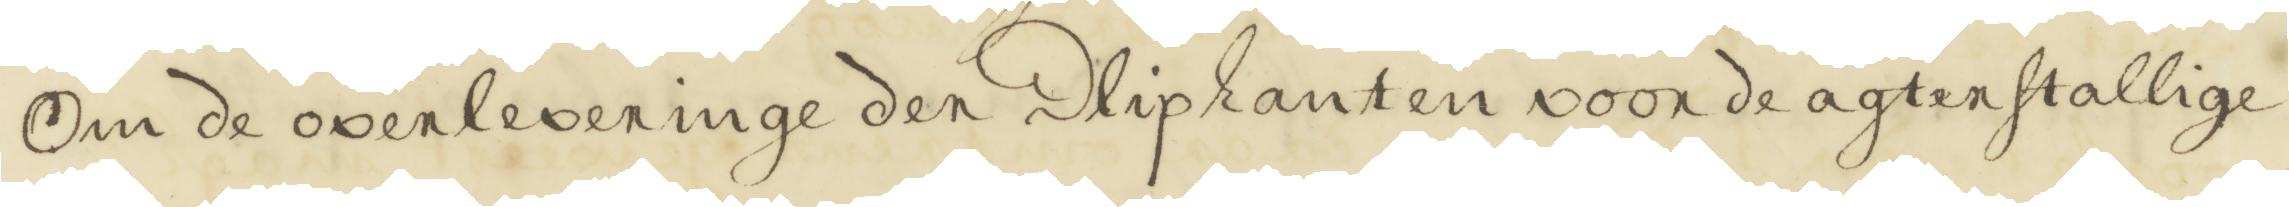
Om de overleveringe der Eliphanten voor de agterstallige
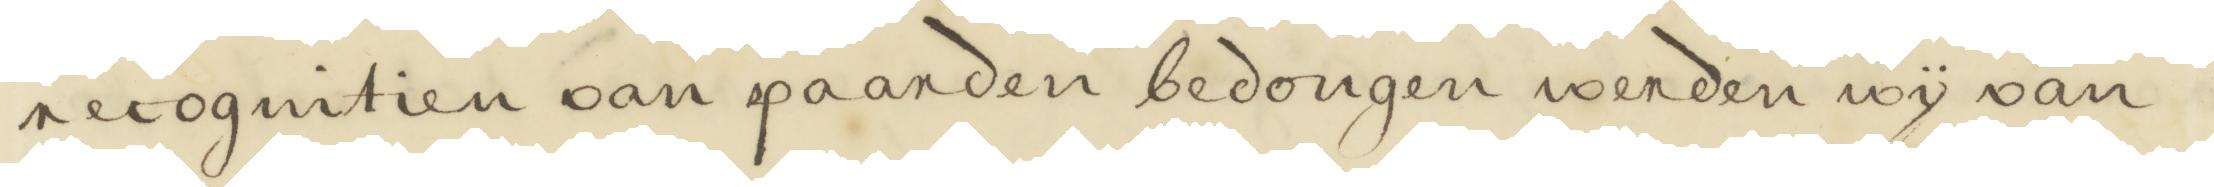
recognitien van paarden bedongen werden wij van
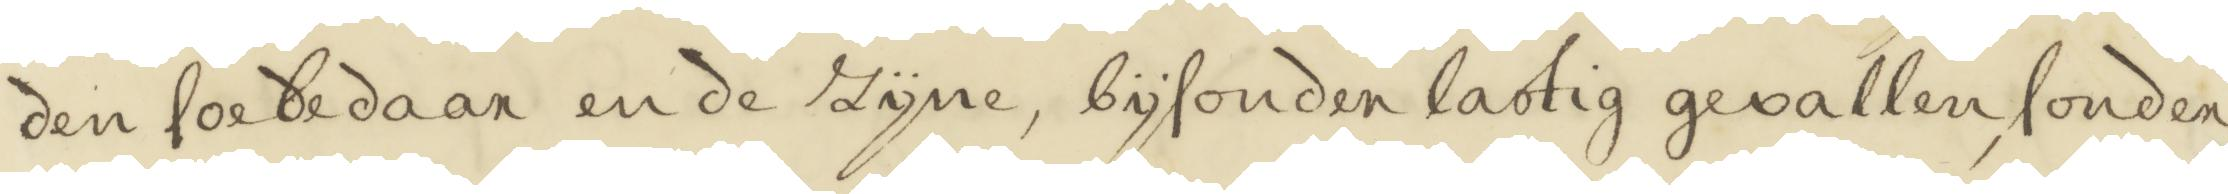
den soebedaar en de zijne, bijsonder lastig gevallen, sonder
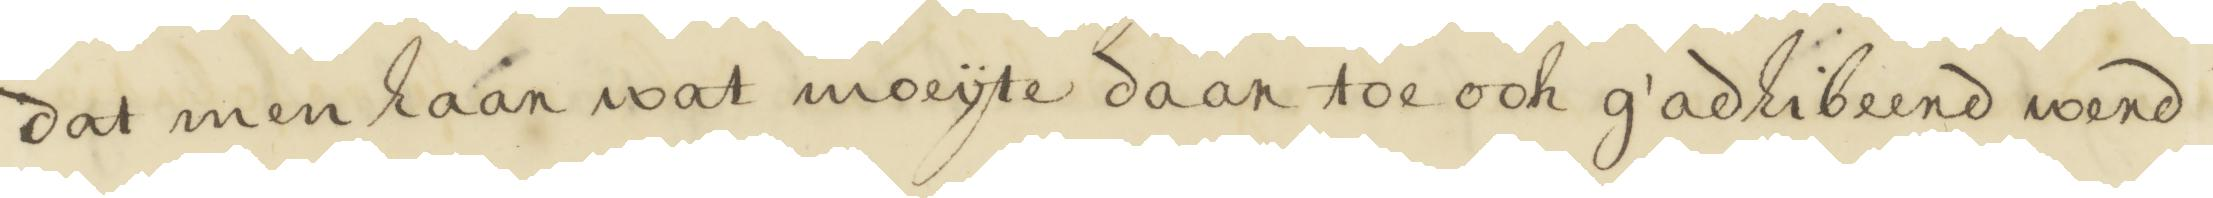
dat men haar wat moeijte daar toe ook g’adhibeerd werd
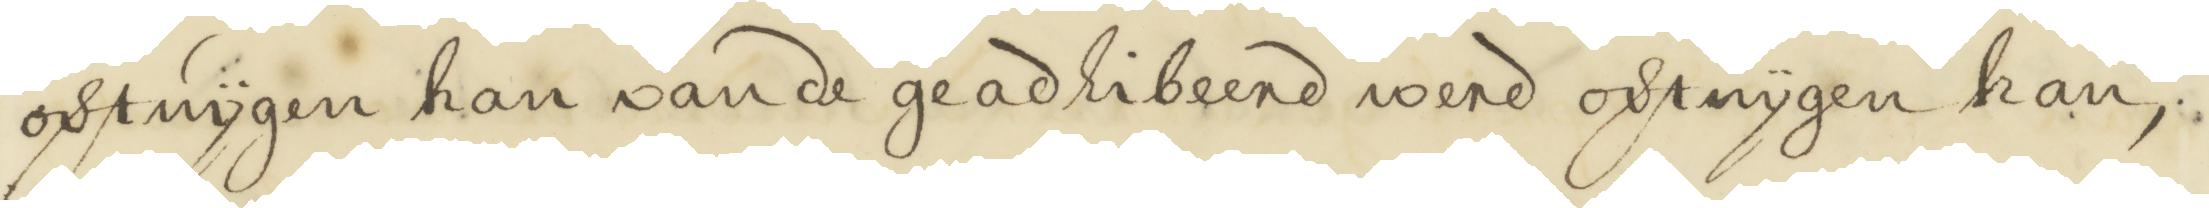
overtuijgen kan van de geadhibeerd werd overtuijgen kan,
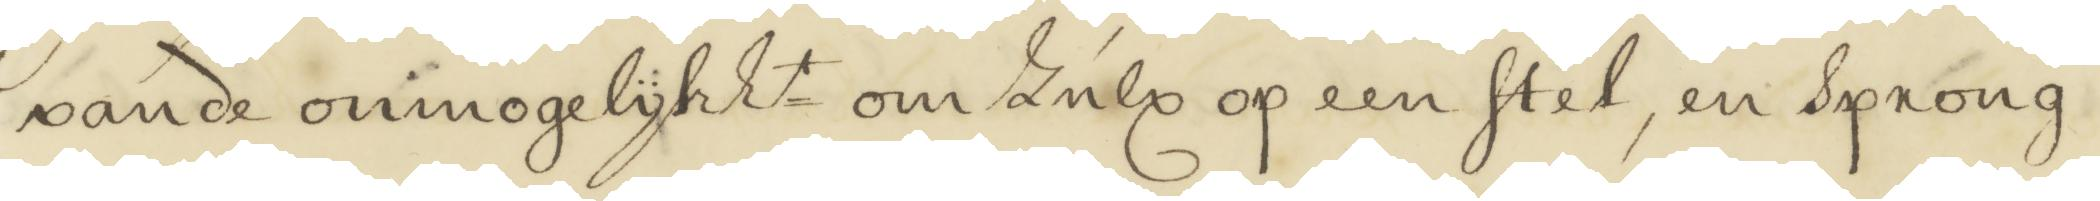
van de onmogelijkh=t om zulx op een stel, en sprong
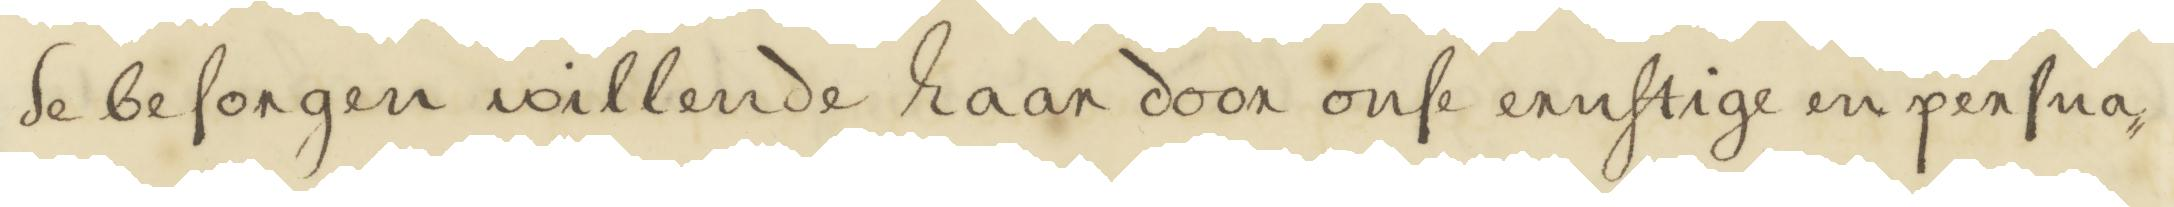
te besorgen willende haar door onse ernstige en persua„
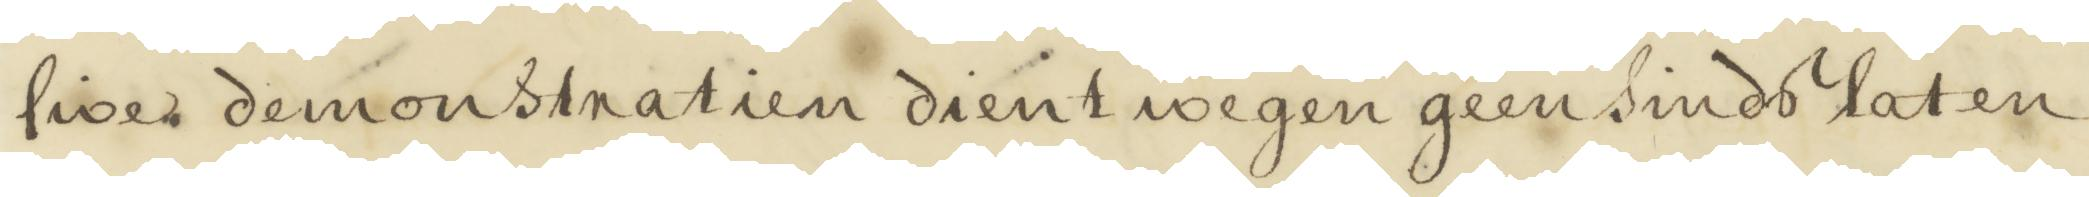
sive demonstratien dient wegen geen sinds laten
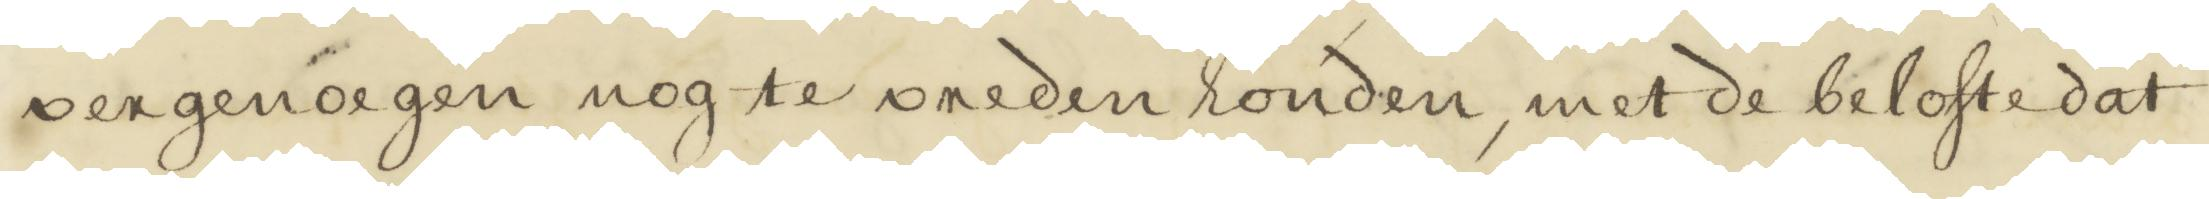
vergenoegen, nog te vreden houden, met de belofte dat
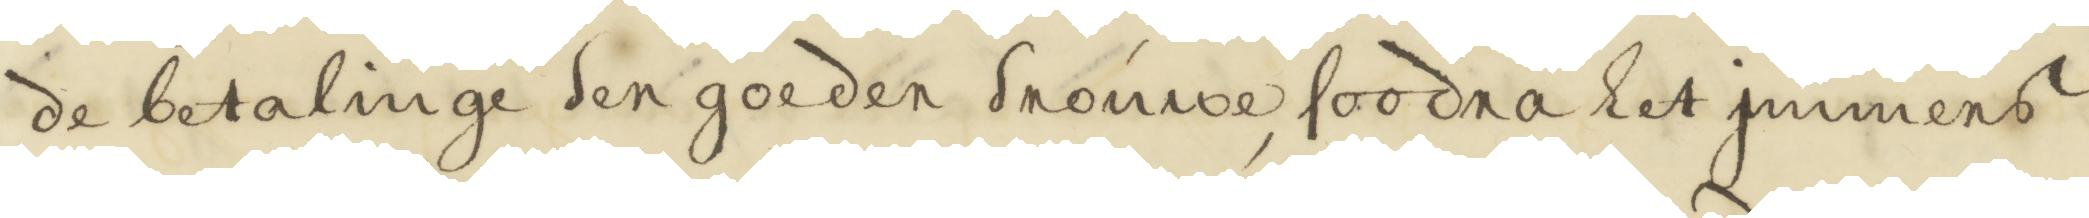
de betalinge ter goeder trouwe, soodra het jmmers
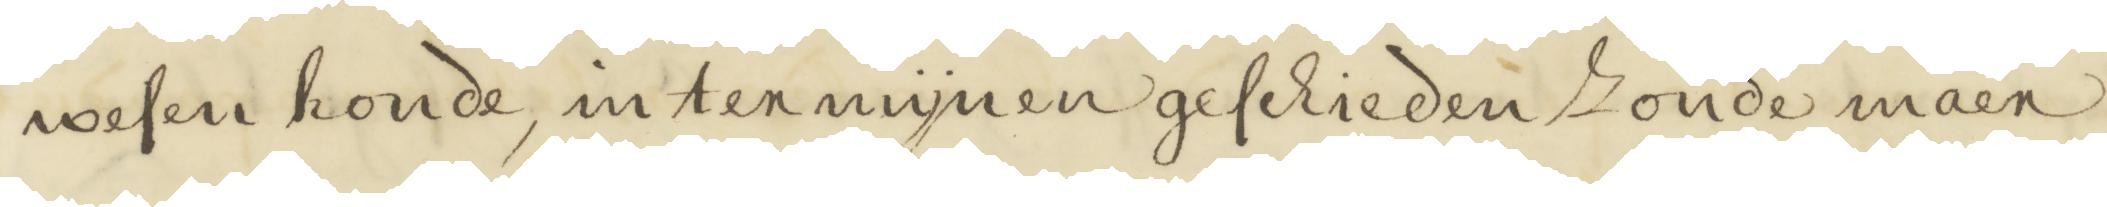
wesen konde, in termijnen geschieden zoude, maer
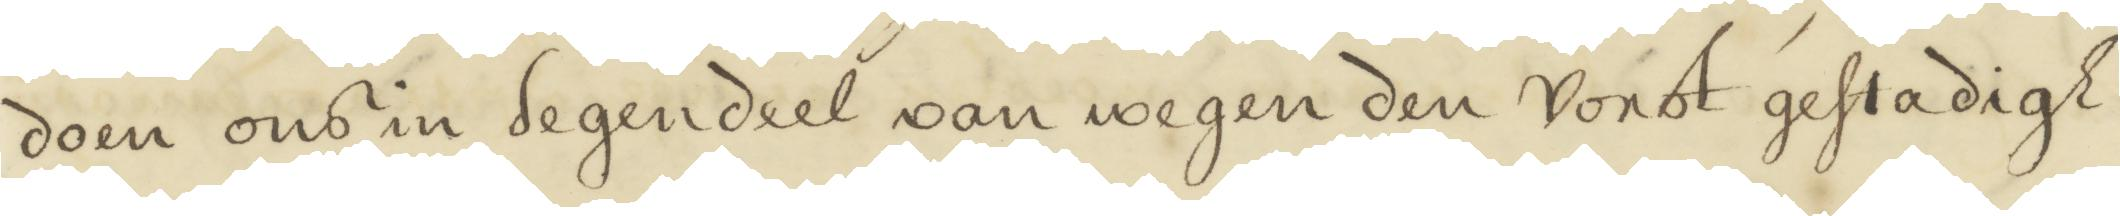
doen ons in tegendeel van wegen den Vorst gestadigh
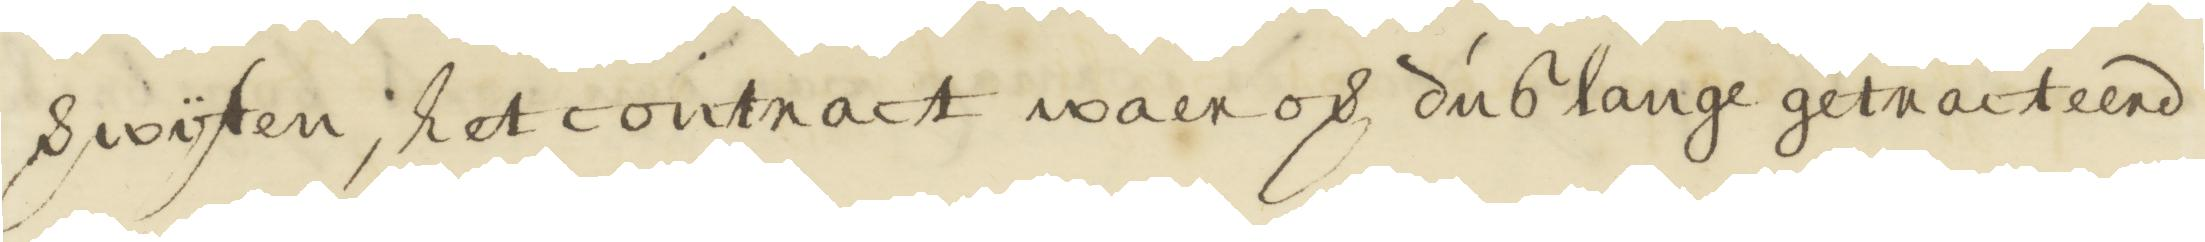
verwijten, het contract waer over dus lange getracteerd
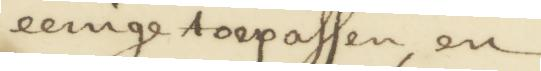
eenige toepassen, en
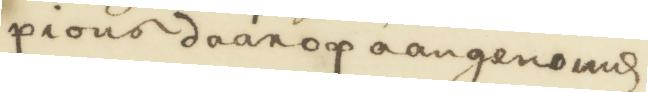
pious daarop aangenomen
